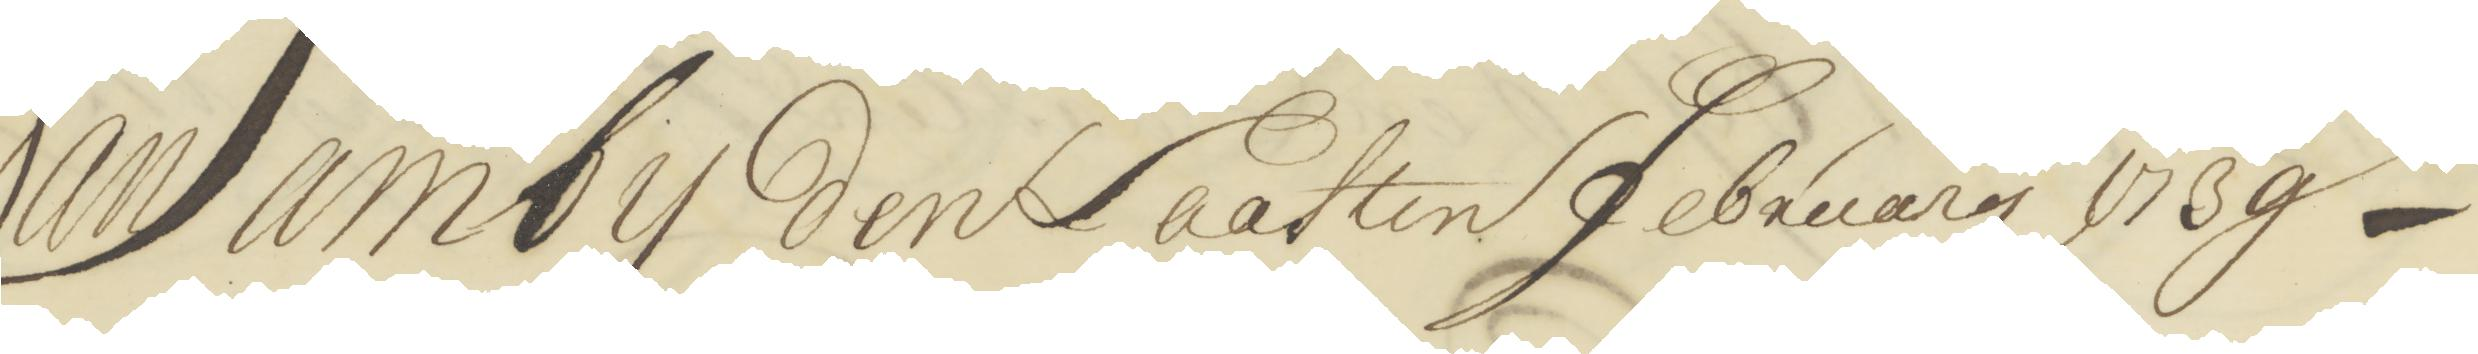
Van Jamby den Laasten Februarij 1739-
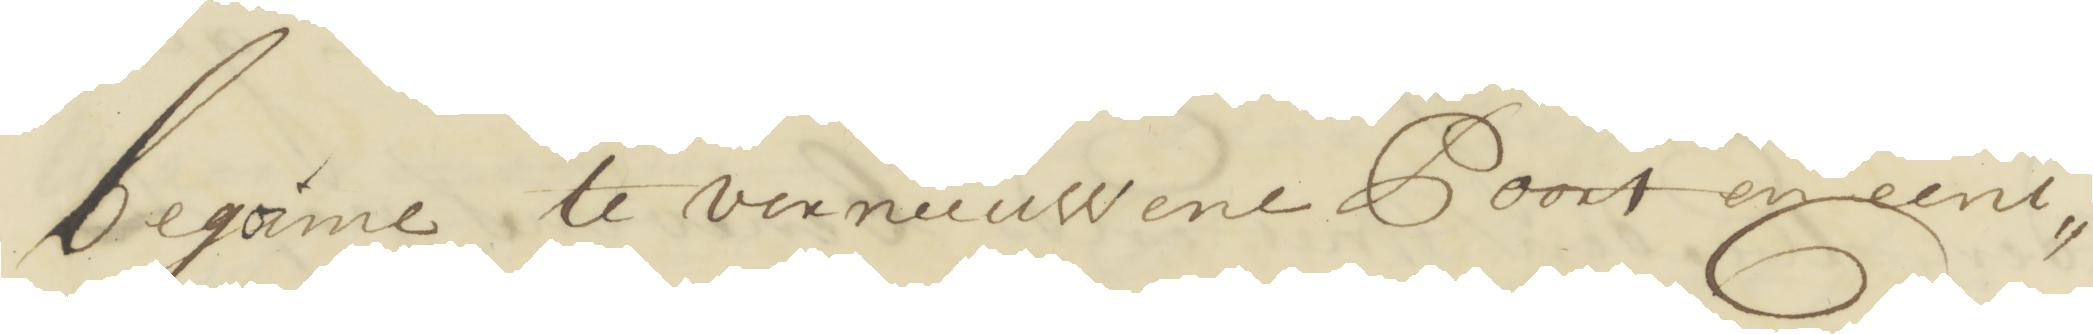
begonne te vernieuwene Poort en eeni„
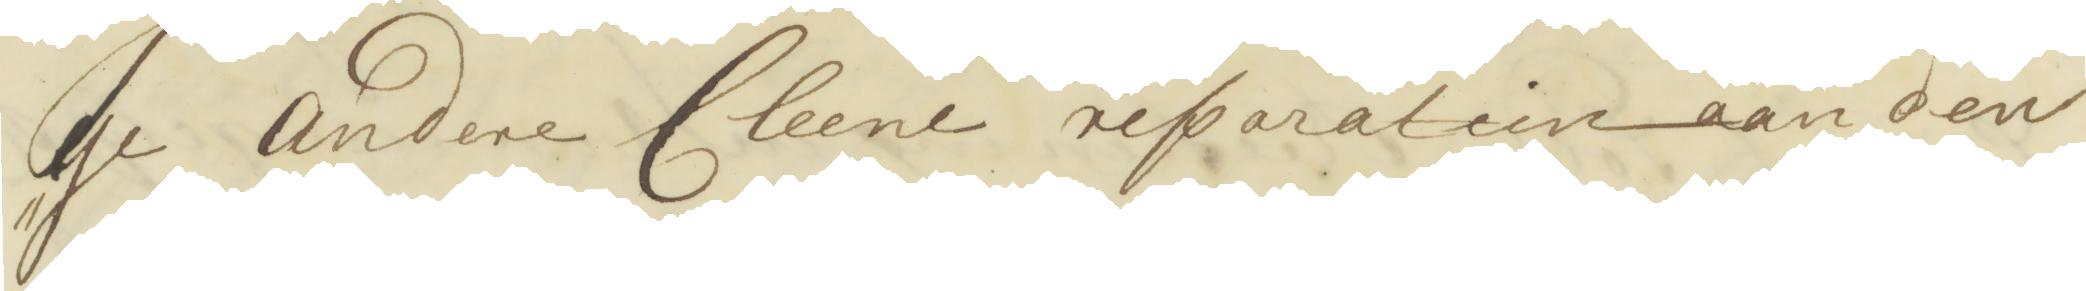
„ge andere Cleene reparatien aan den
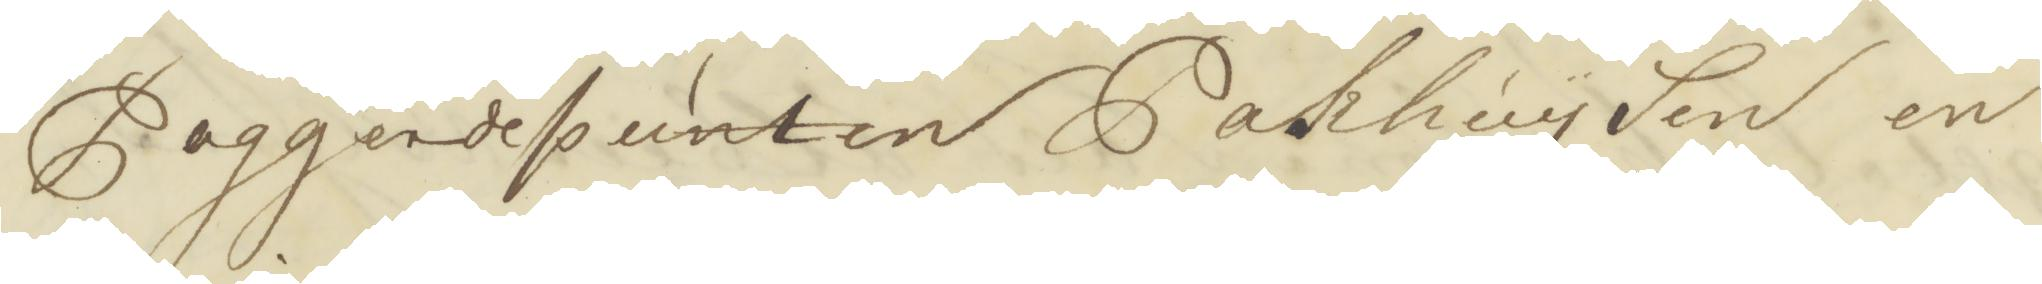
Paggerdepunten Pakhuijsen en
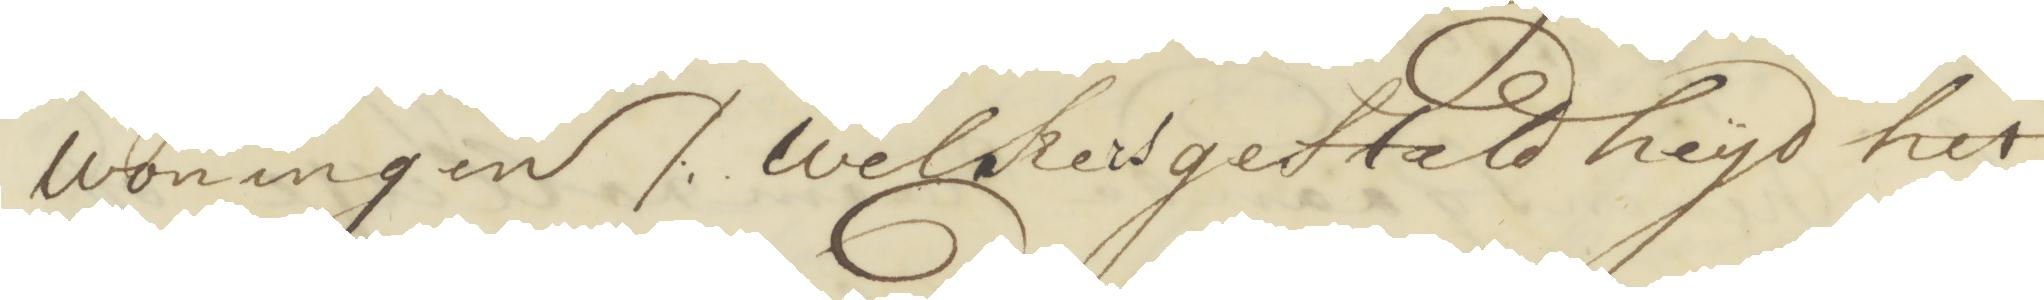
woningen /: welkers gesteldheijd het
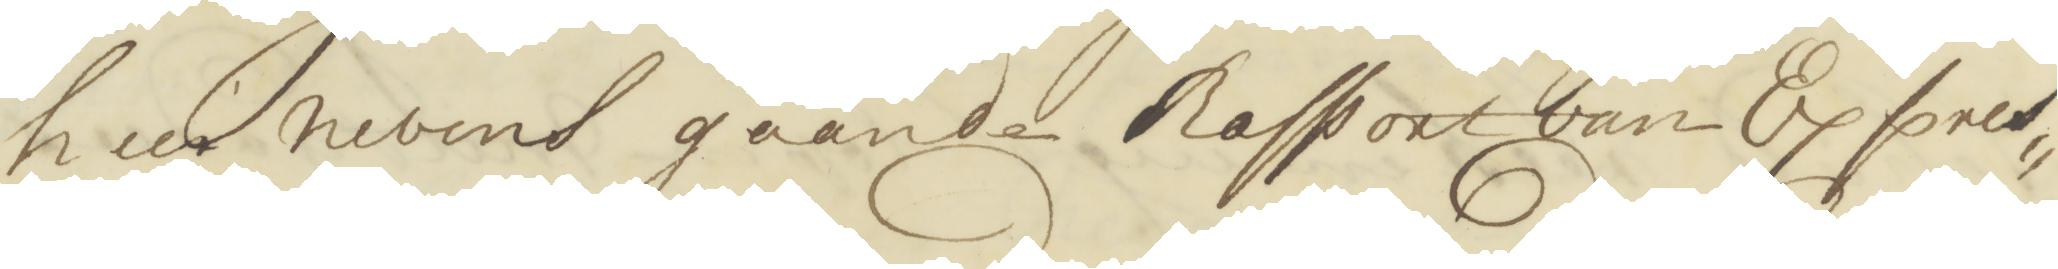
hier nevens gaande Rapport van Expres„
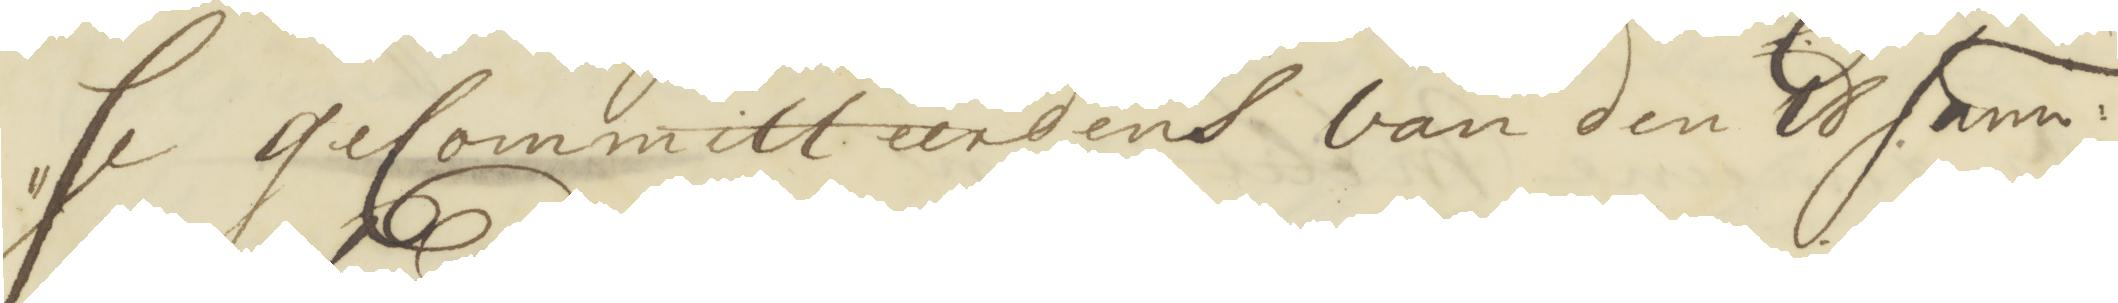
„se gecomitteerdens van den 18 Jann:
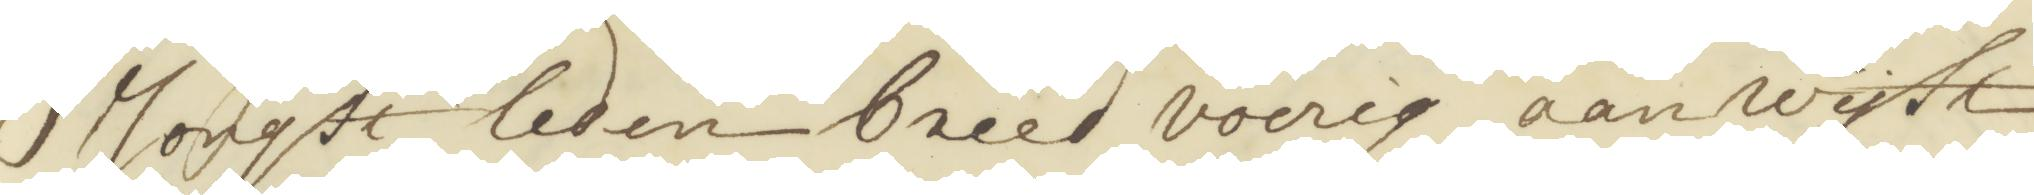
Jongst leden breed voerig aanwijst
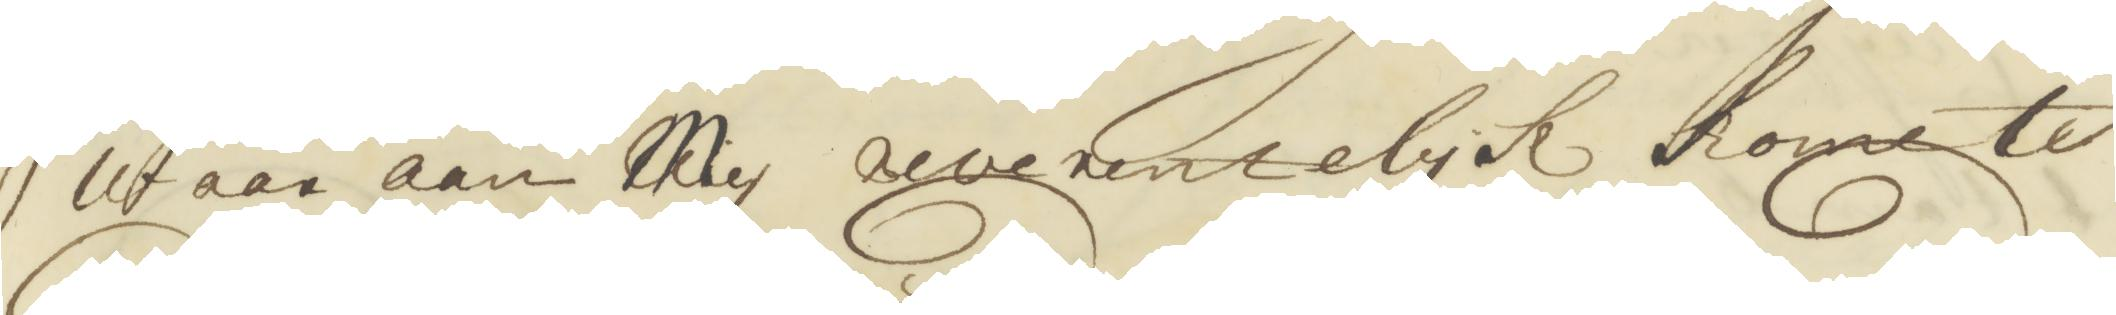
waar aan my reverentelijck kome te
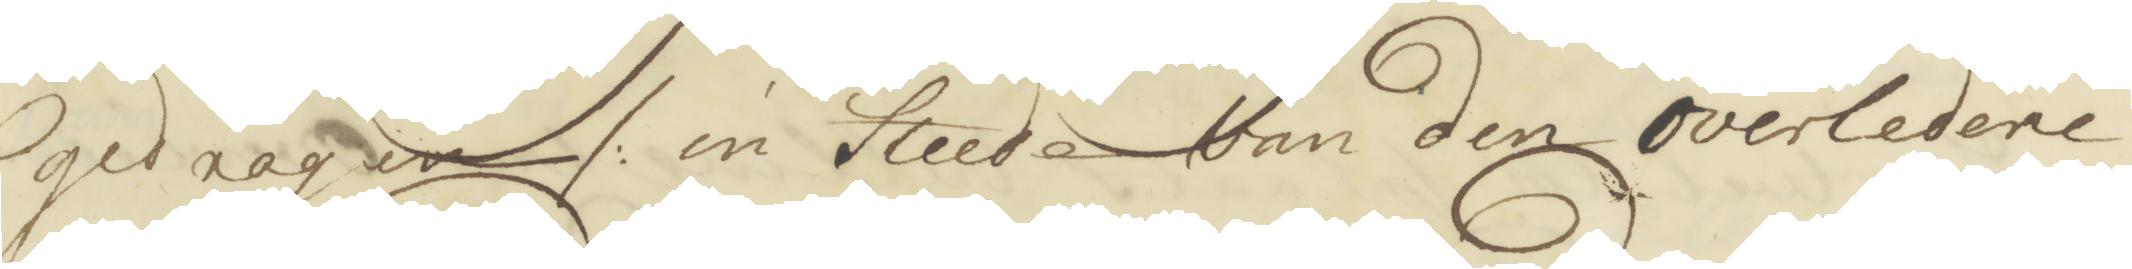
gedragen /: in steede van den overledere
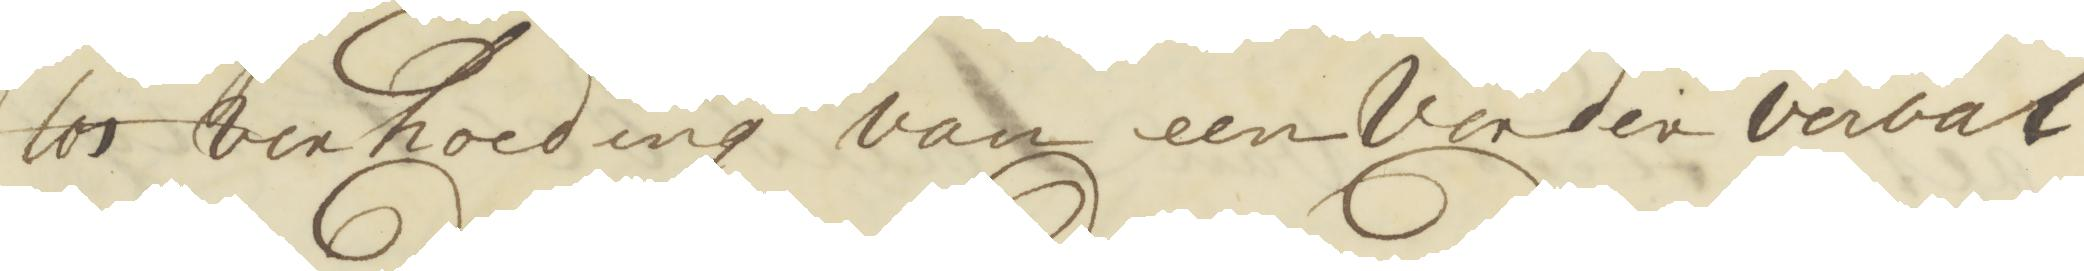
tot verhoeding van een verder verval
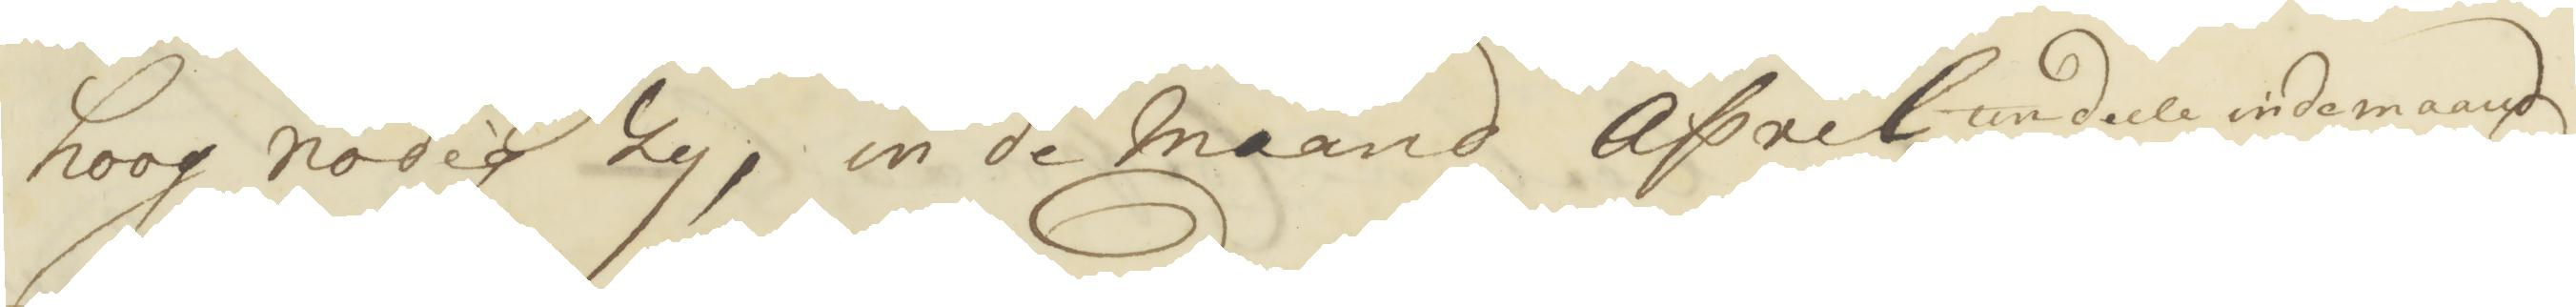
hoog nodig zy, in de maand April ten deele indemaand
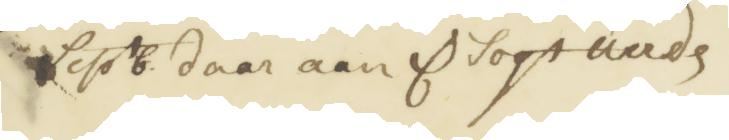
Septb. daar aan versogt werden
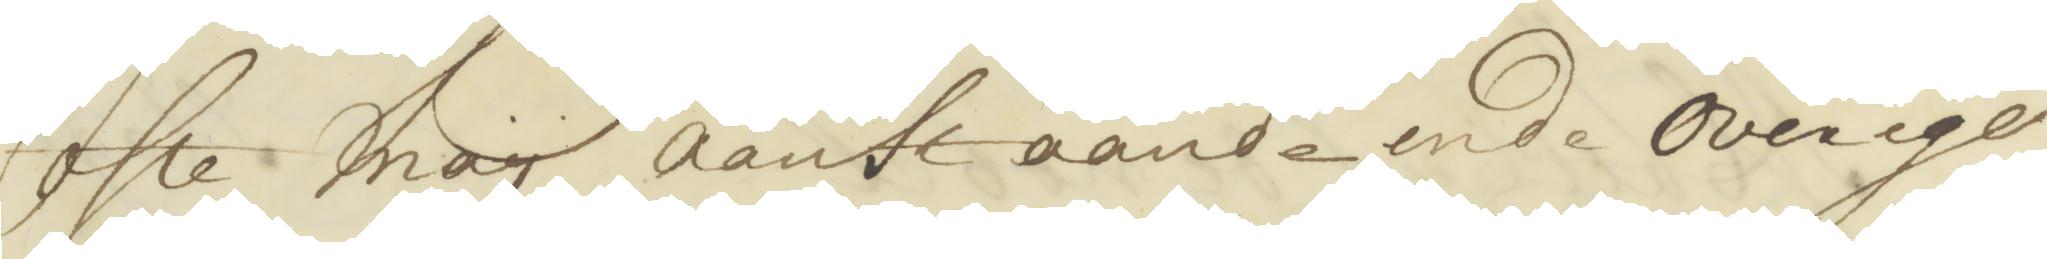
ofte maij aanstaande ende overige
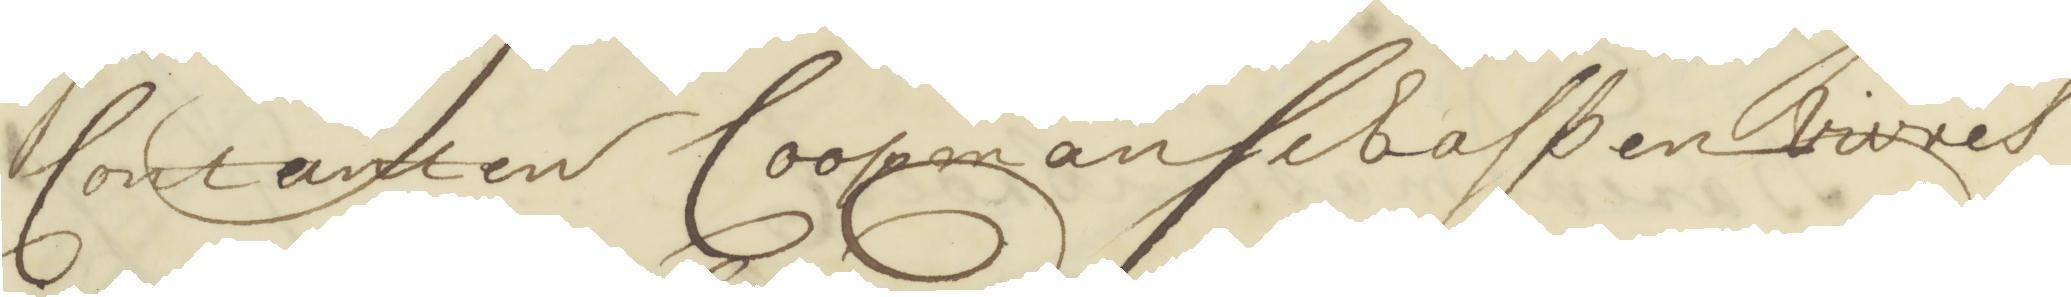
Contanten Coopmanschappen vivres
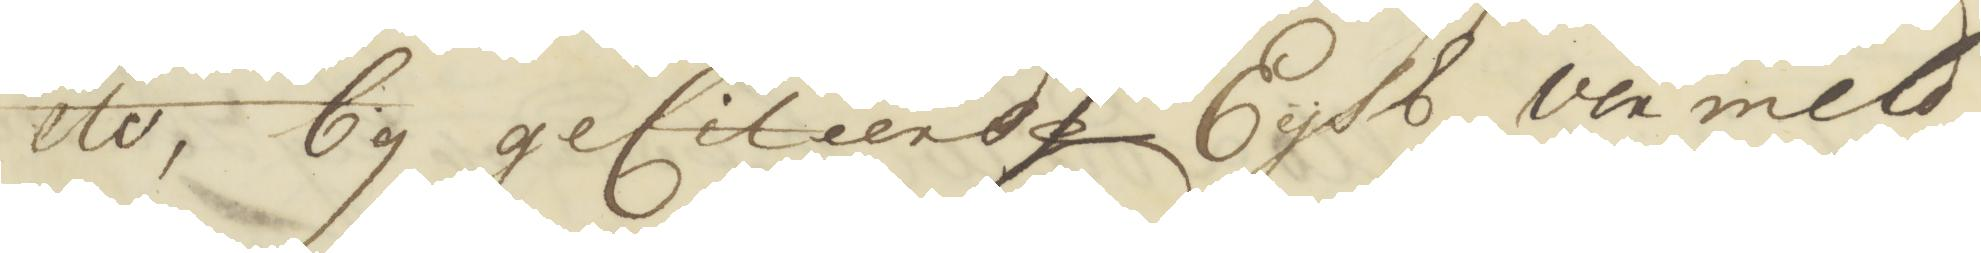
etc, bij geciteerde Eijsh vermeld
